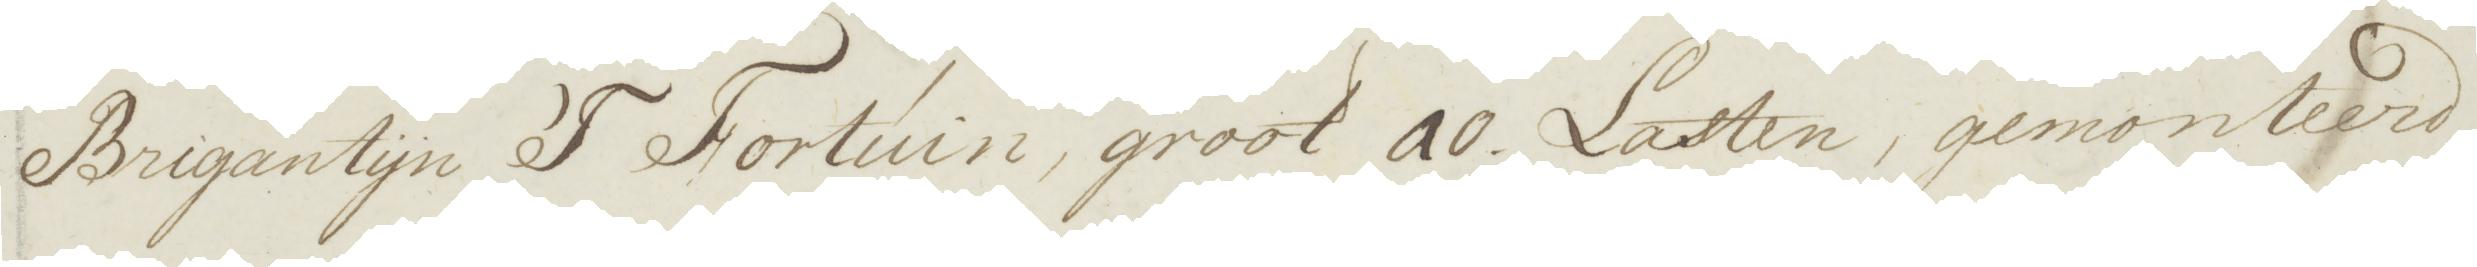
Brigantijn 'T Fortuin, groot 40. Lasten, gemonteerd
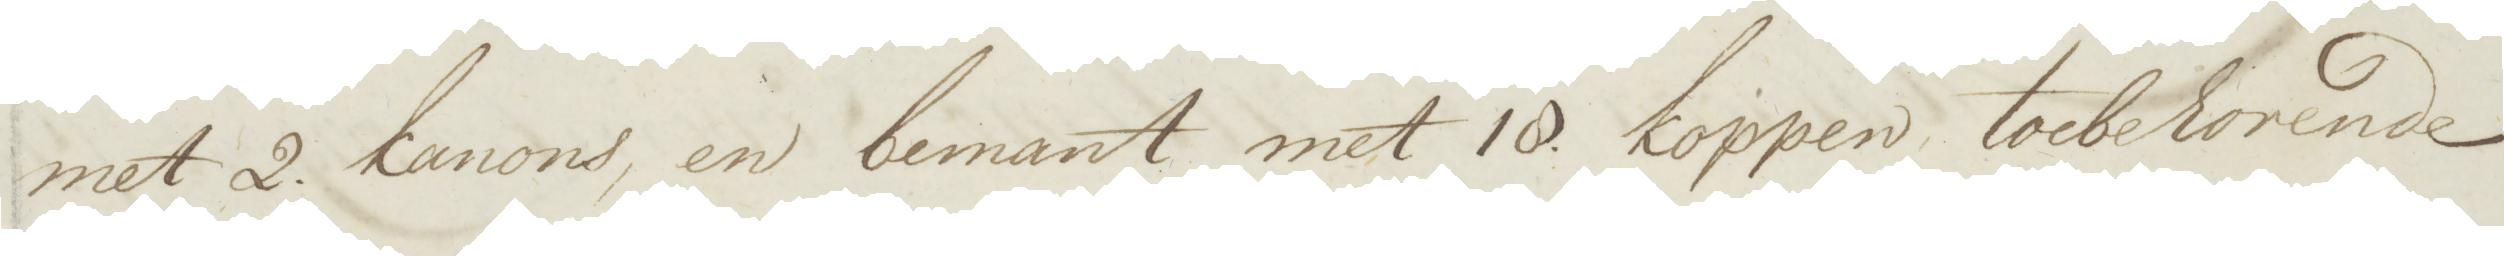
met 2. kanons, en bemant met 18. koppen, toebehorende
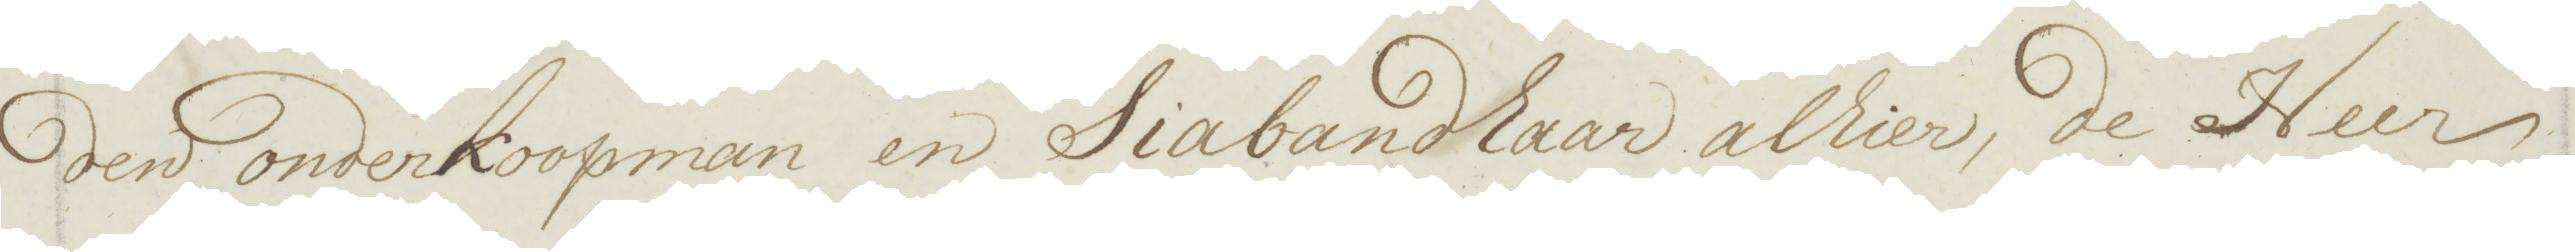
den onderkoopman en Siabandhaar alhier, de Heer
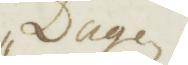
„Dagen
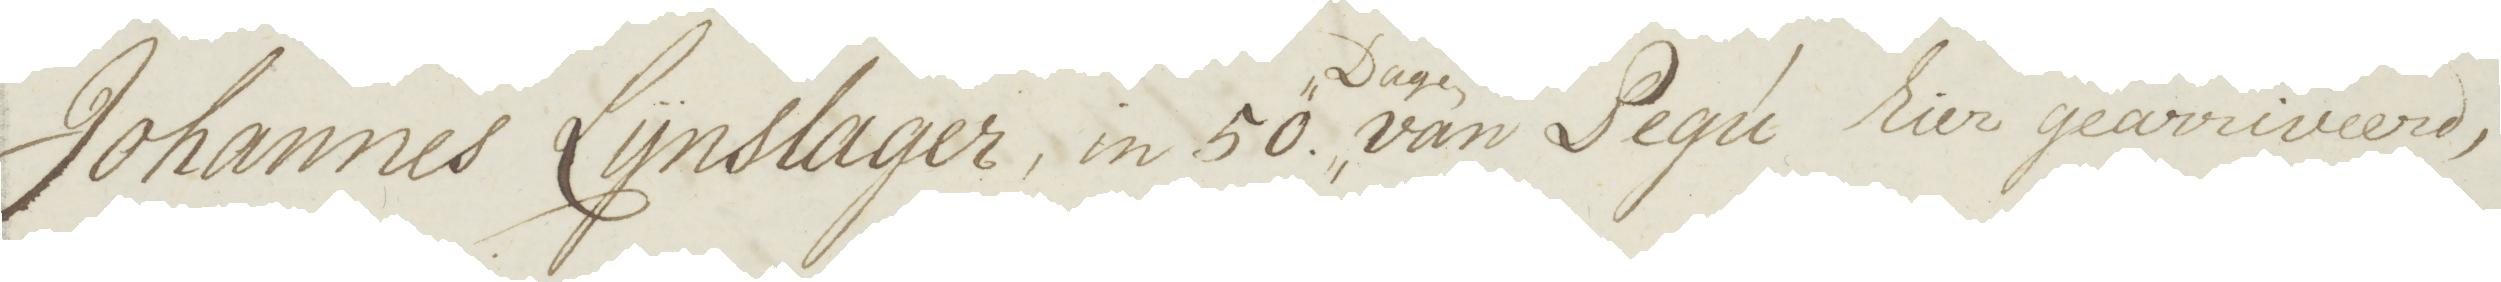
Johannes Lijnslager, in 50. „ van Pegu hier gearriveerd,
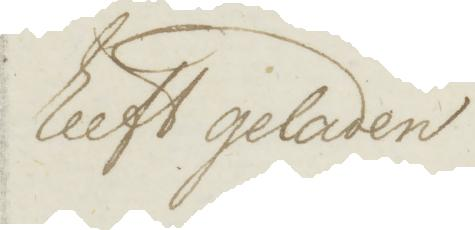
heeft geladen
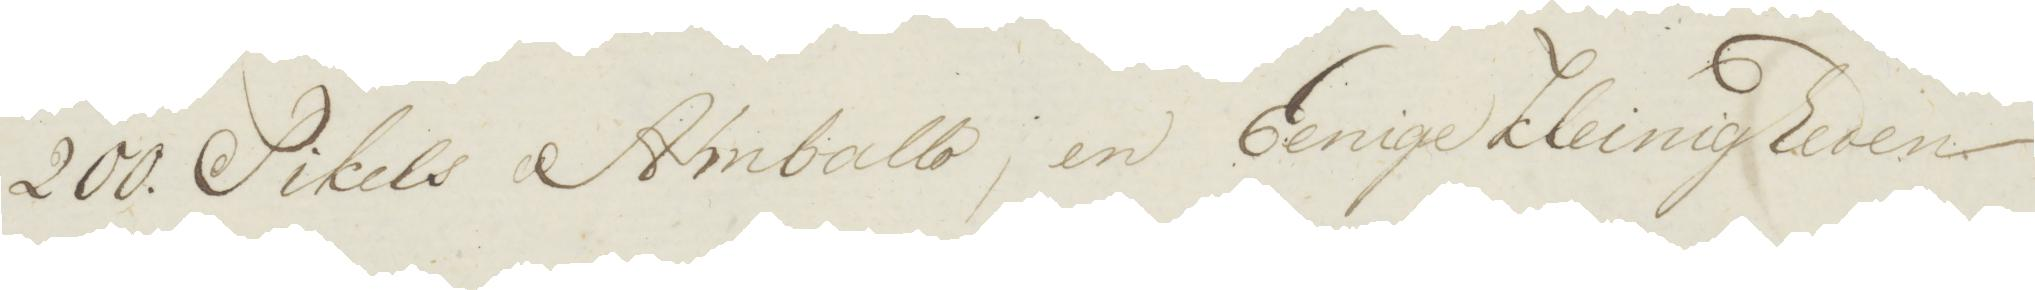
200. Pikels Amballo; en Eenige kleinigheden
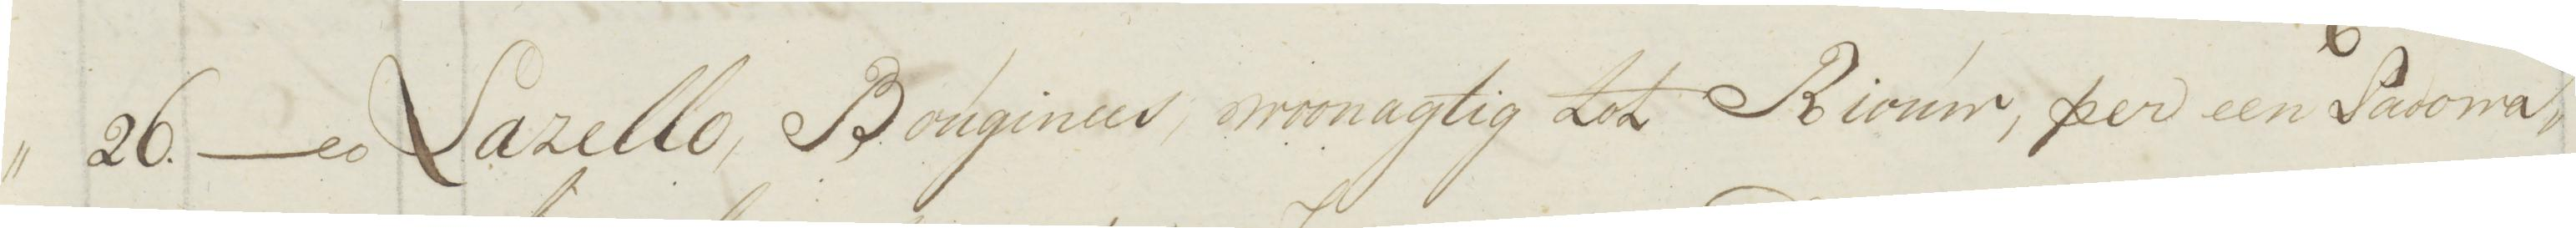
„ 26. _o Lazello, Bouginees, woonagtig tot Riouw, per een Sadowa„
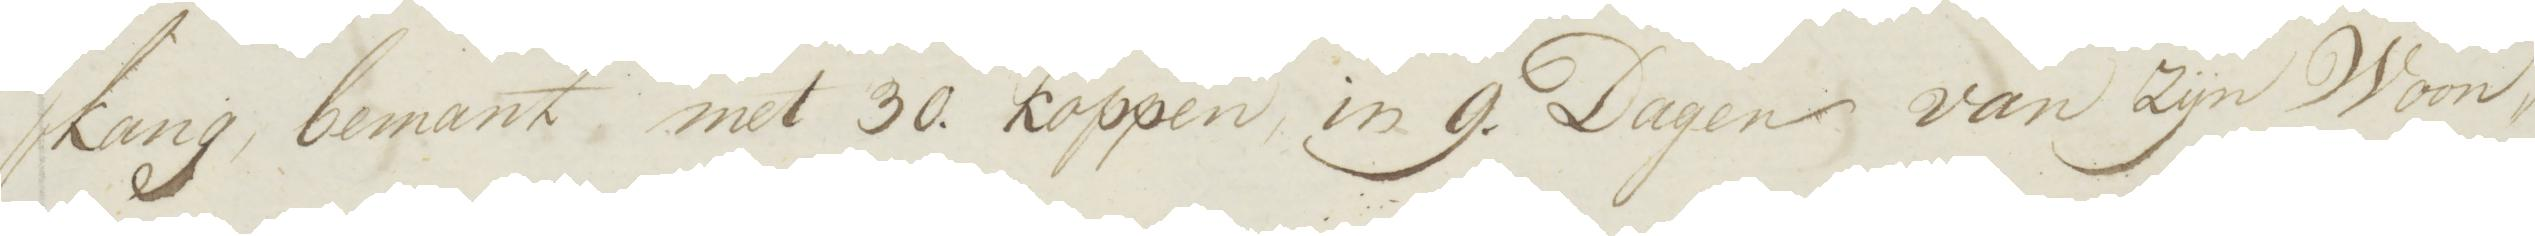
„kang, bemant met 30. koppen, in 9. Dagen van zijn Woon„
